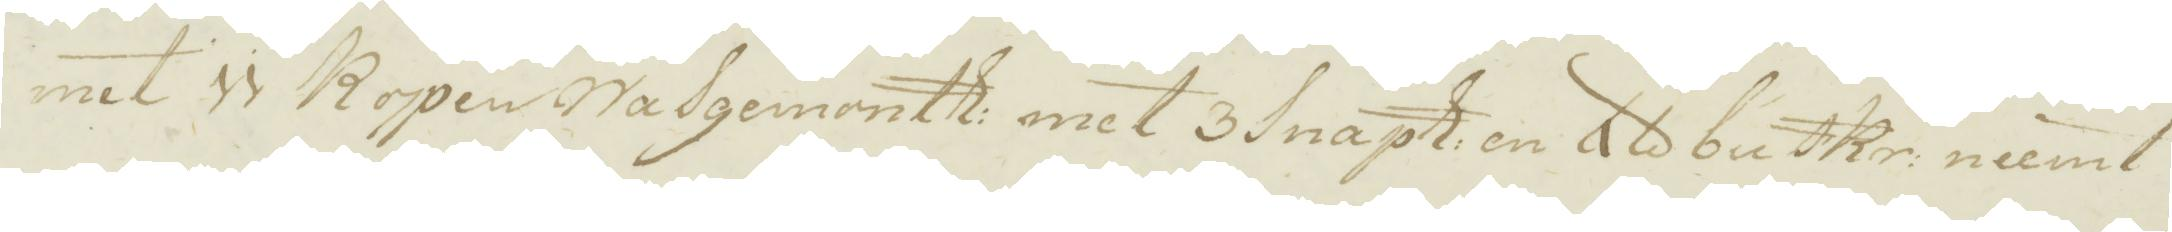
met 11 koppen was gemonth: met 3 snaph: en 4 lb buskr: neemt
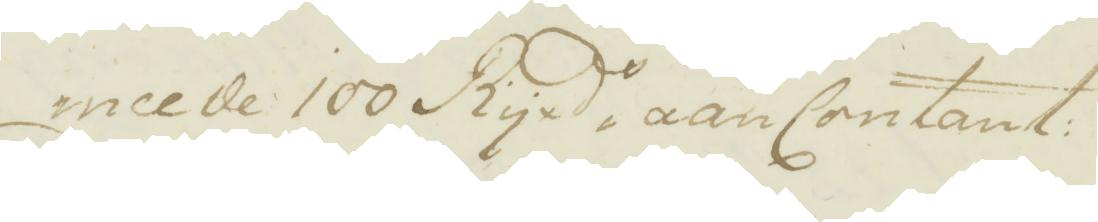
meede 100 Rijxd„s aan Contant:
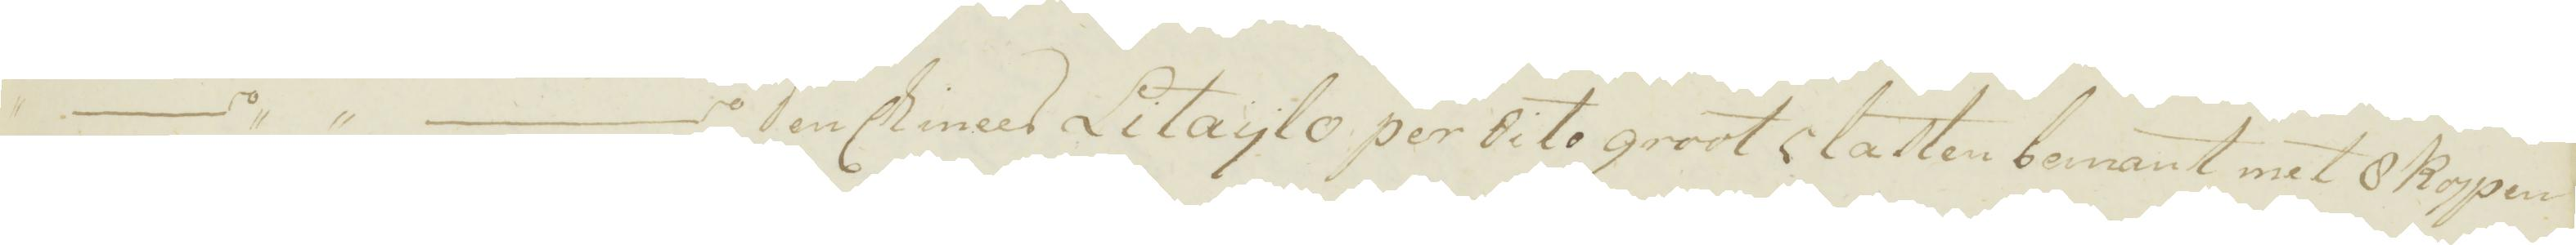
„ _o„ „ _o den Chinees Litaijlo per dito groot 5 lasten bemant met 8 koppen
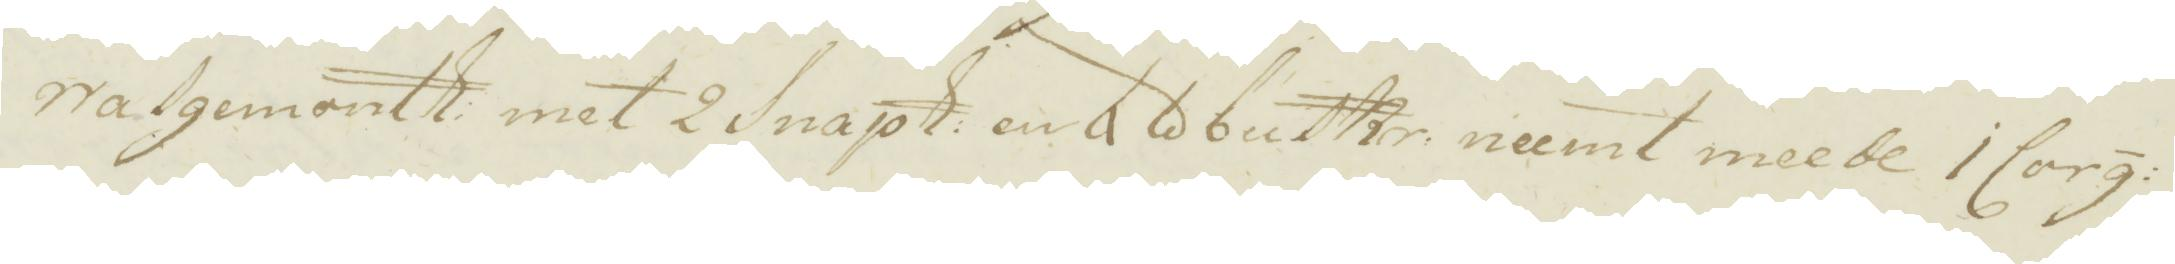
was gemonth: met 2 snaph: en 4 lb buskr: neemt meede 1 Corg:
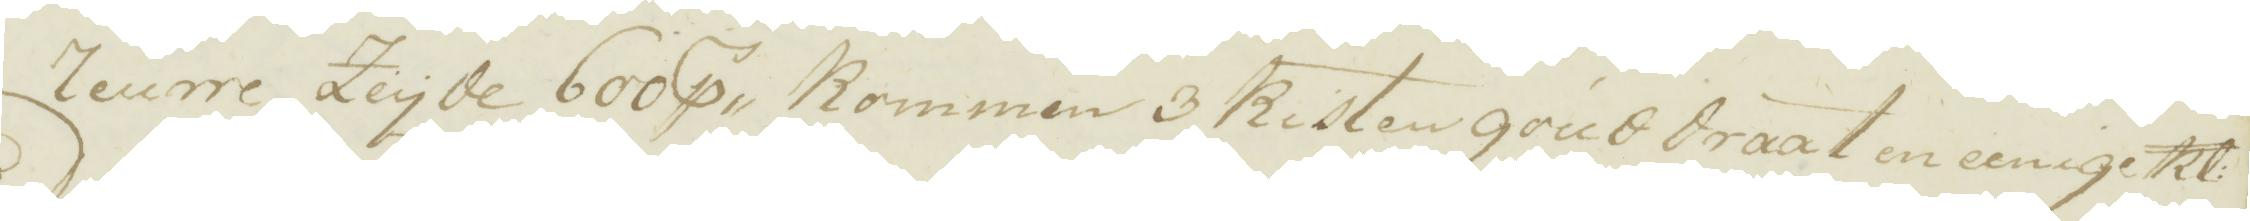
reuwe zeijde 600 p„s kommen 3 kisten goud draat en eenige kl:
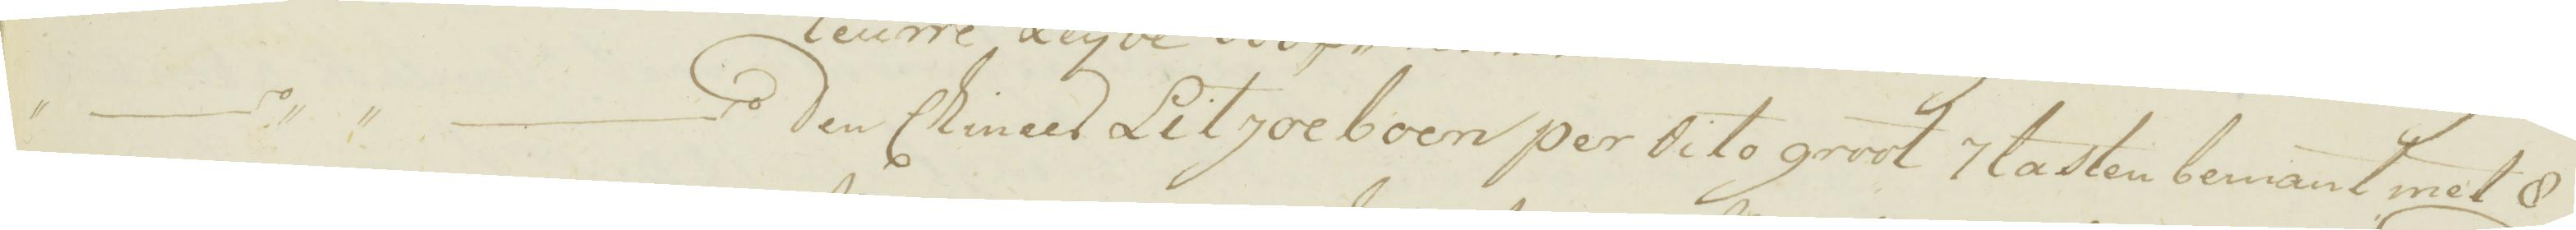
„ _o„ „ _o den Chinees Litjoeboen per dito groot 7 lasten bemant met 8
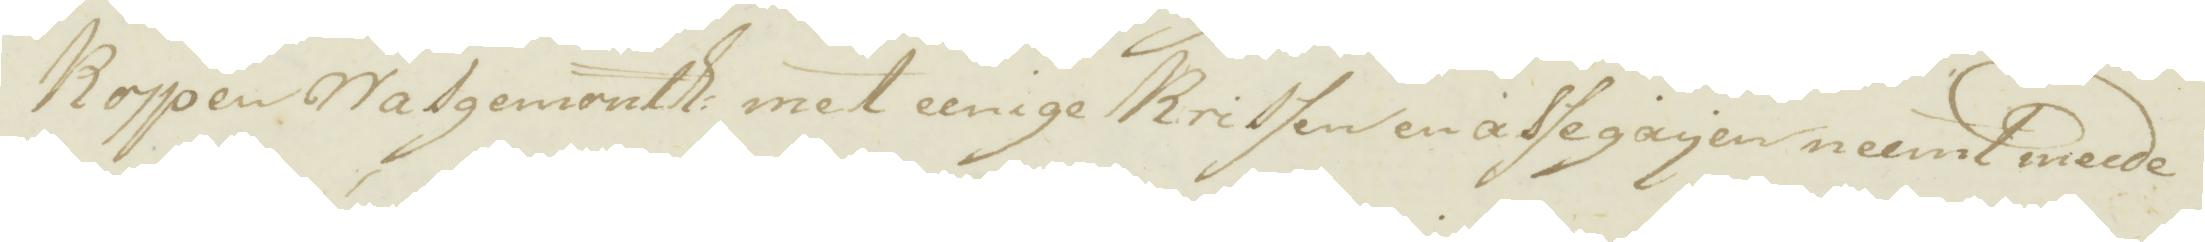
koppen was gemonth: met eenige krissen en assegaijen neemt meede
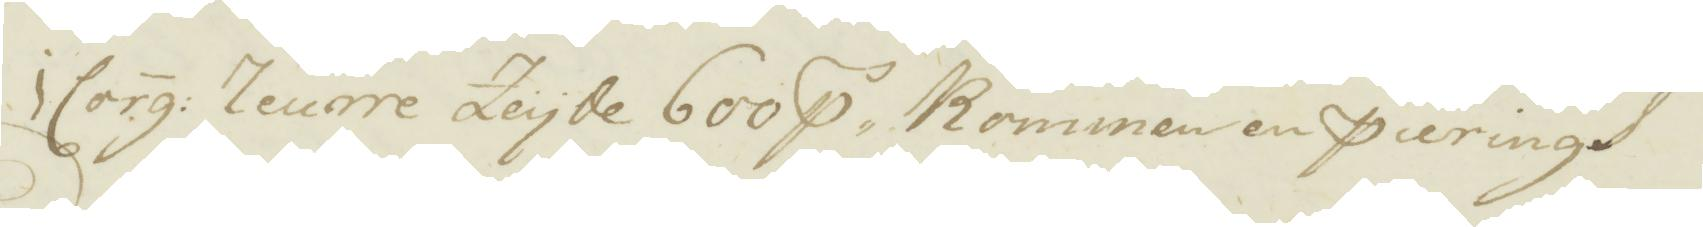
1 Corg: reuwe zeijde 600 p„s kommen en pierings
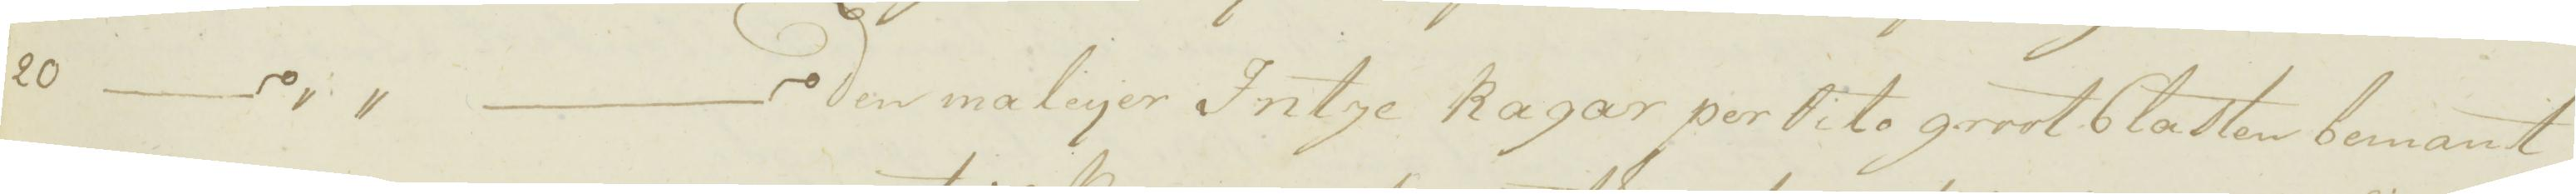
20 _o„ „ _o den maleijer Intje kagar per dito groot 6 lasten bemant
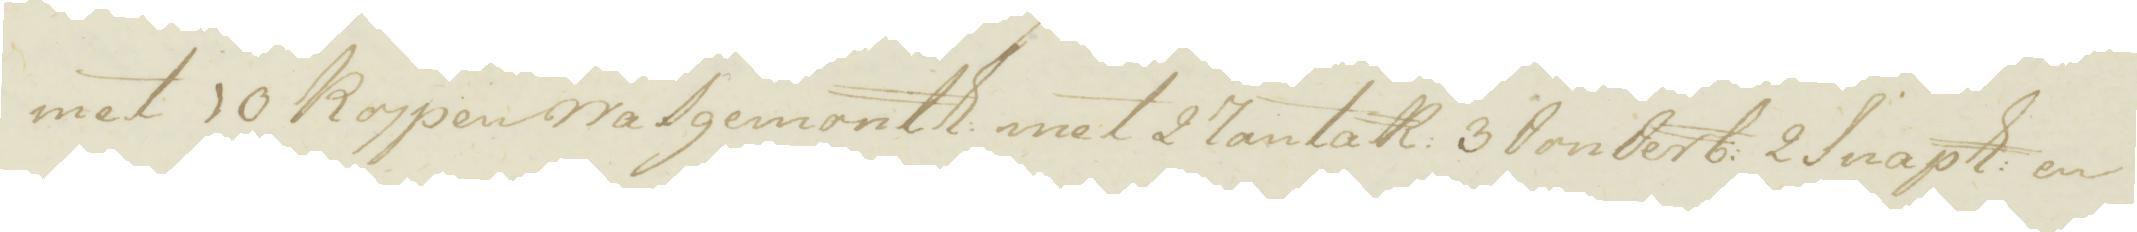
met 10 koppen was gemonth: met 2 rantak: 3 donderb: 2 snaph: en
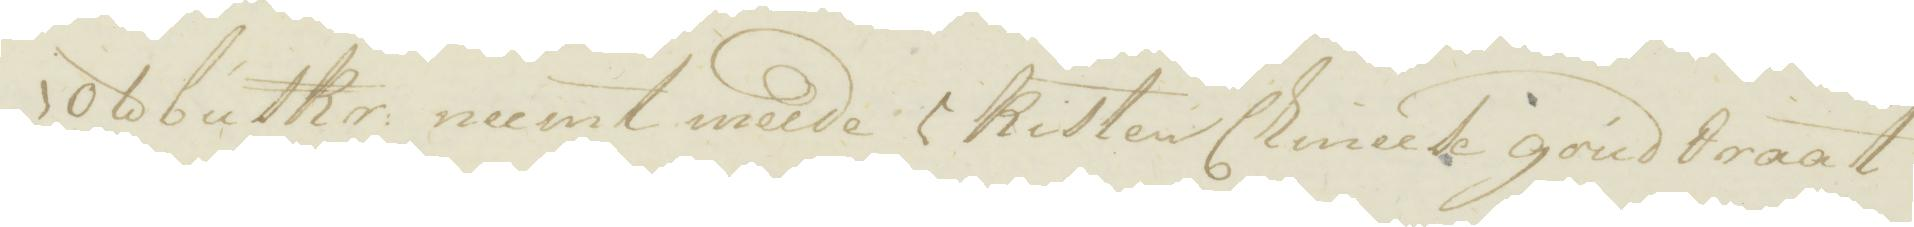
10 lb buskr: neemt meede 5 kisten Chineese goud draat
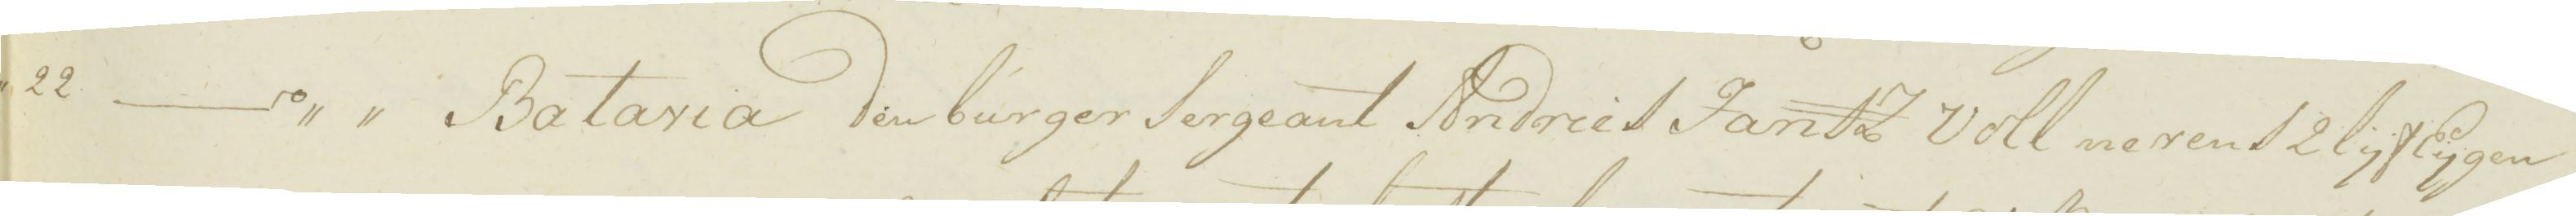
22 _o„ „ Batavia den burger sergeant Andries Iansz Voll nevens 2 lijf Eijgen
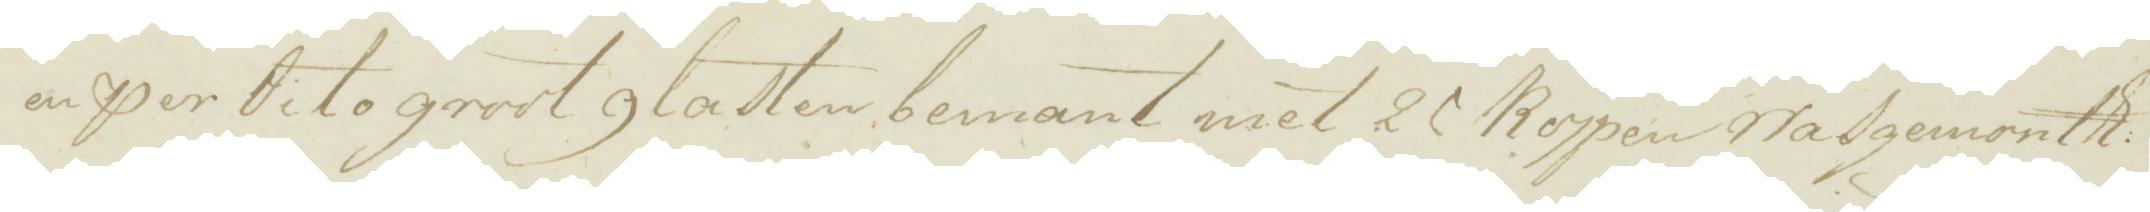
en per dito groot 9 lasten bemant met 25 koppen was gemonth:
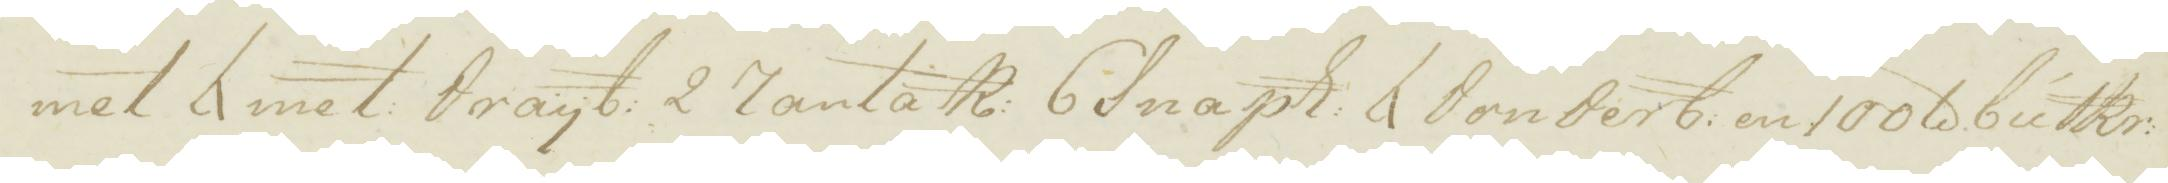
met 4 met draijb: 2 rantak: 6 snaph: 4 donderb: en 100 lb buskr:
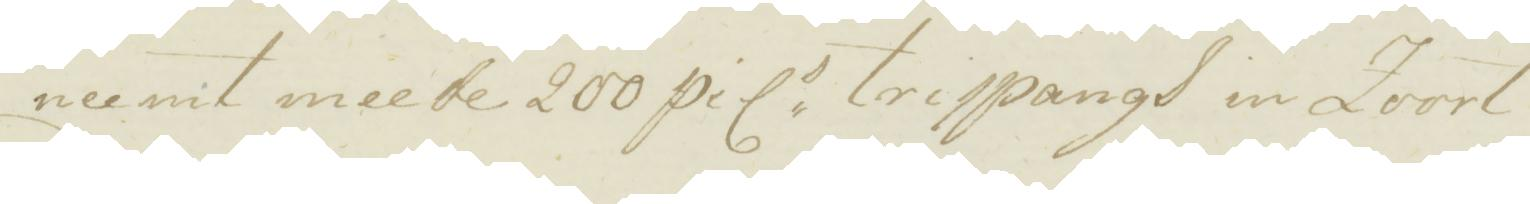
neemt meede 200 piC„s trippangs in zoort
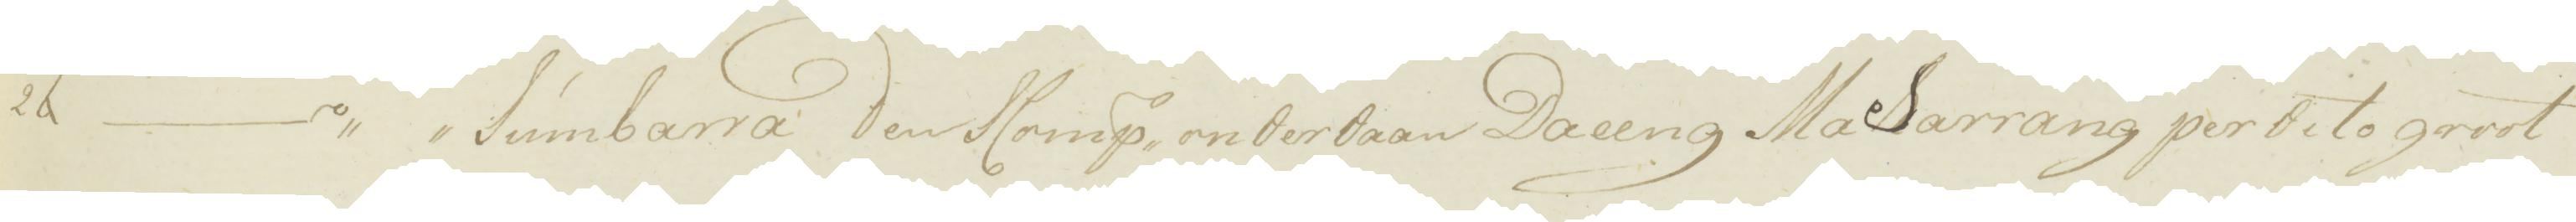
24 _o „ sumbawa den sComp„s onderdaan Daeeng Ma Sarrang per dito groot
